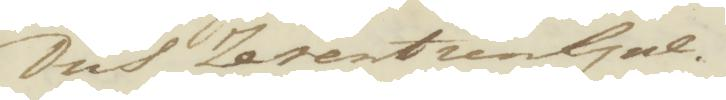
dus Zeventien Gul„
